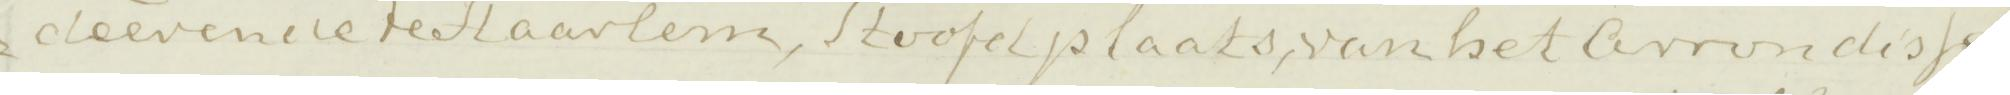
deerende te Haarlem, Hoofdplaats, van het Arrondisse-
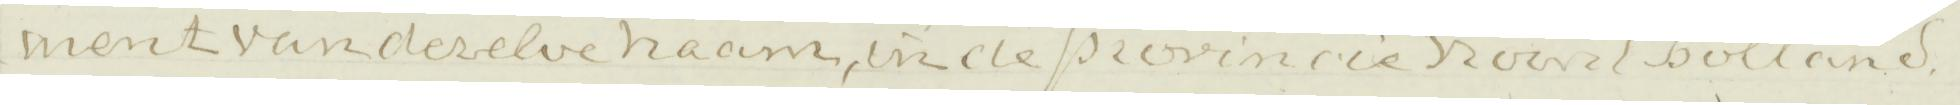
ment van dezelve naam, in de provincie Noord Holland.
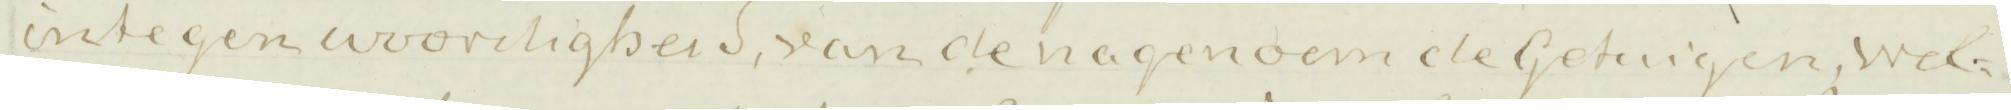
integenwoordigheid, van de nagenoem de Getuigen, wel=
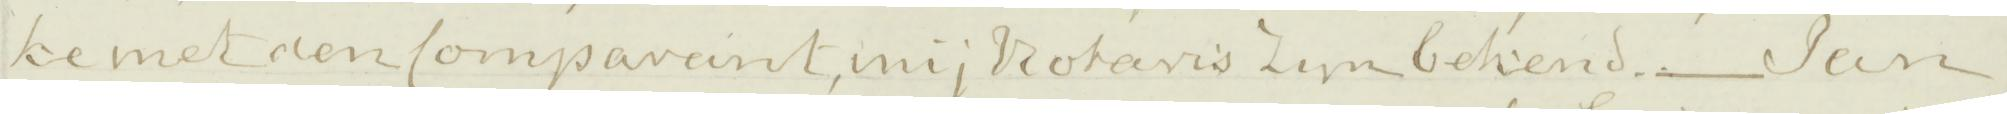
ke met den Comparant, mij Notaris zyn bekend. — Jan
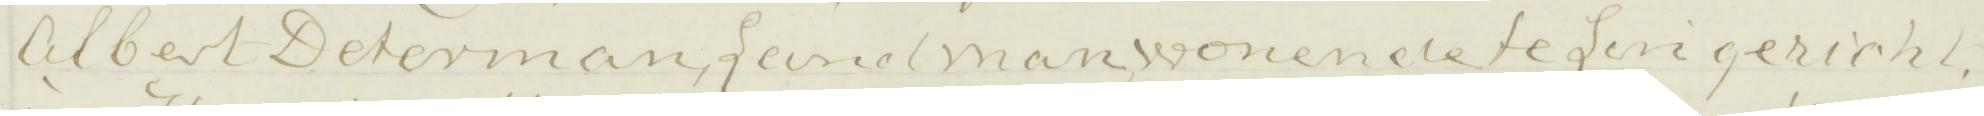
Albert Determan, Landman, wonende te Longericht,
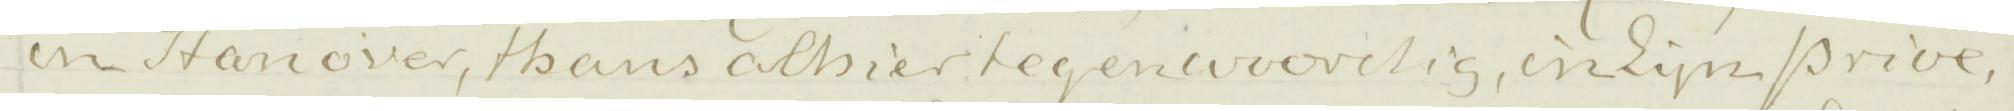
in Hanover, thans alhier tegenwoordig, in zijn prive,
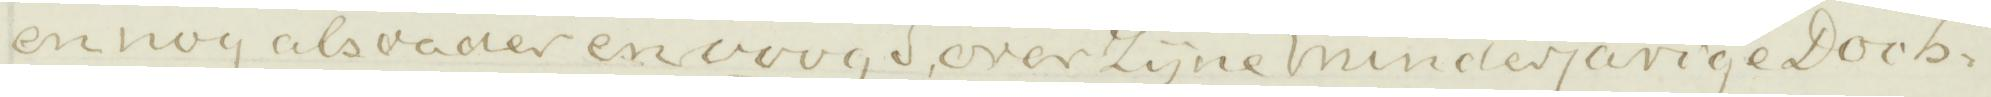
en nog als vader en voogd, over zijne minderjarige Doch=
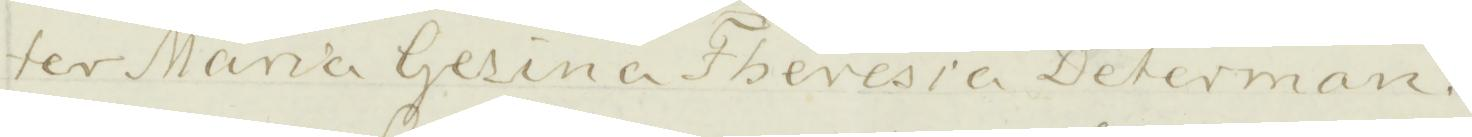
ter Maria Gezina Theresia Determan.
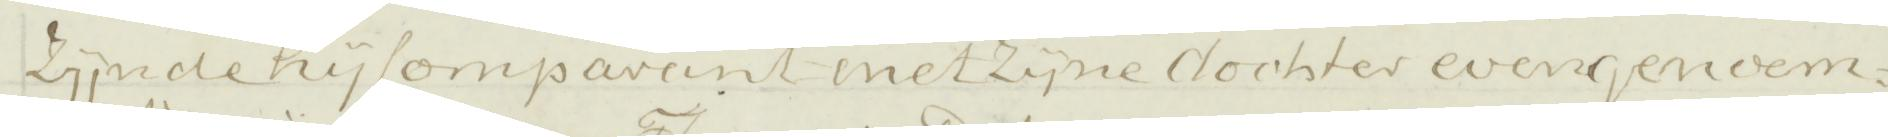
Zijnde hij Comparant met zijne dochter evengenoem
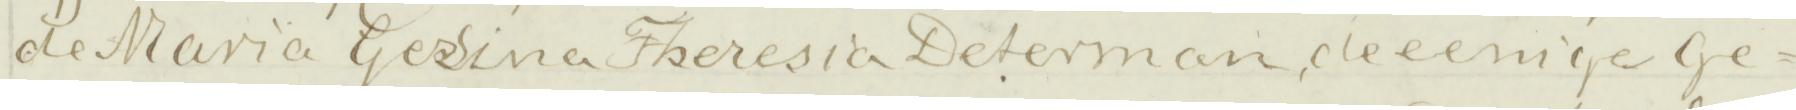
de Maria Gezina Theresia Determan, de eenige ge
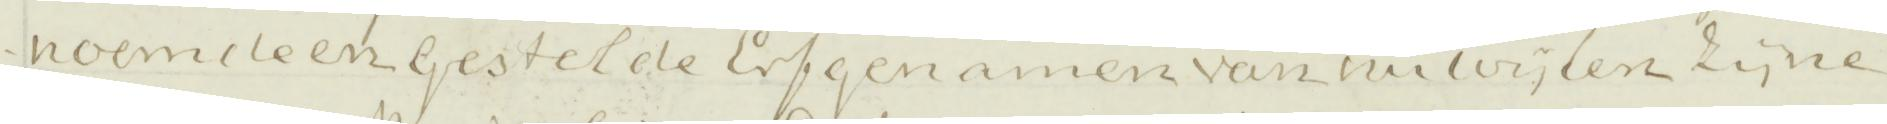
noemde en gestelde Erfgenamen van nu wijlen zijne
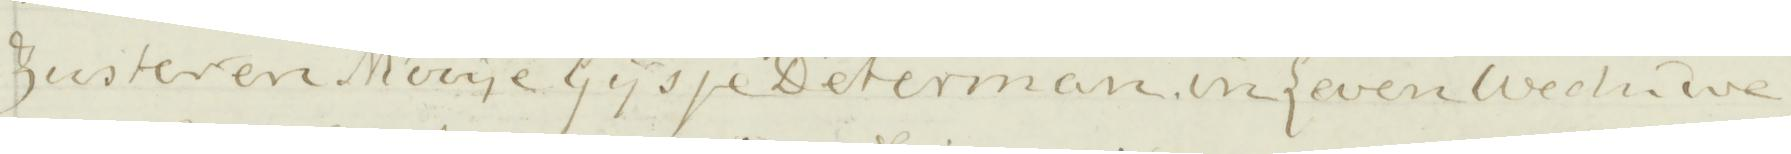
Zuster en Mooije Gijsje Determan, in Leven weduwe
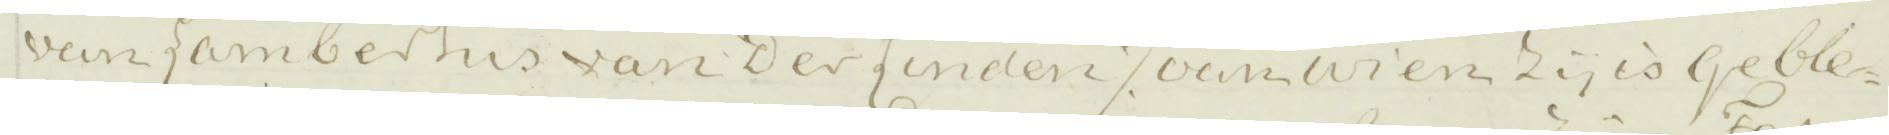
van Lambertus van Der Linden ./. van wien zij is Geble=
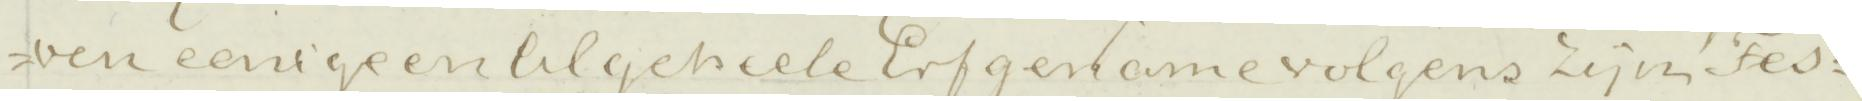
=ven eenige en algeheele Erfgename volgens zijn Tes=
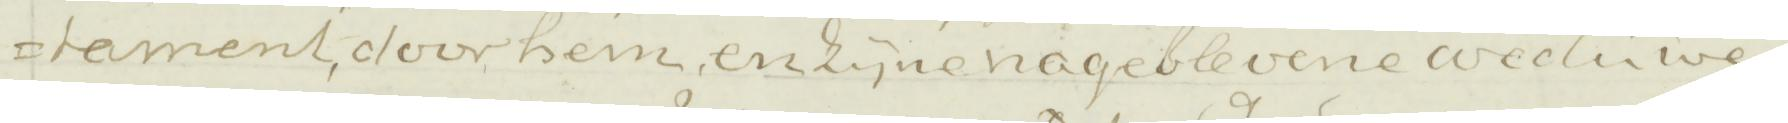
=tament, door hem, en zijne nageblevene weduwe
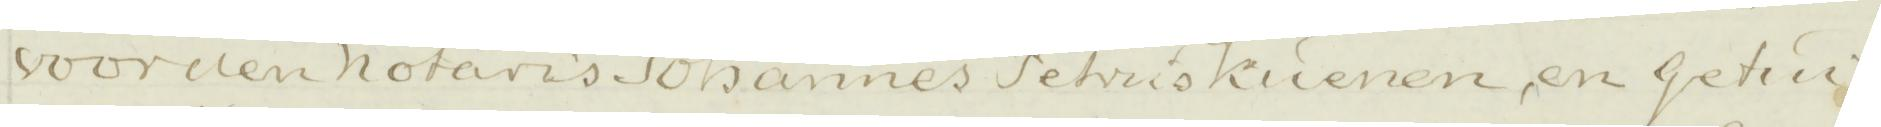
voor den Notaris Johannes Petrus Kuenen, en Getui
